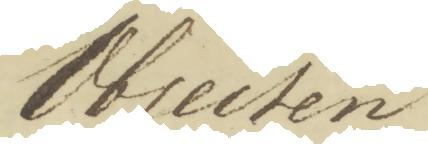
Objecten
